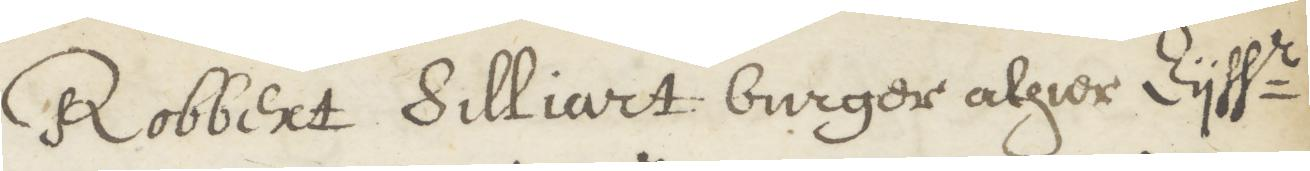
Robbert Silliart burger alhier Eijss=r
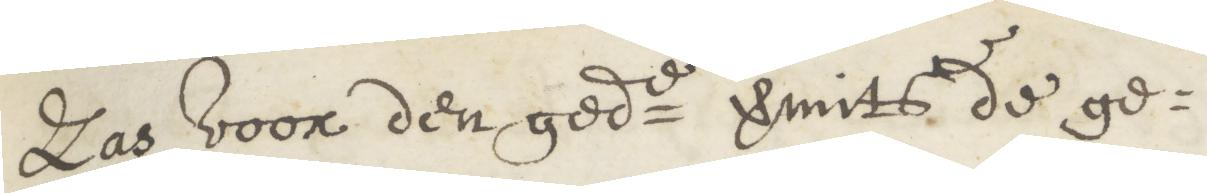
Zas voor den ged=e vermits de ge=
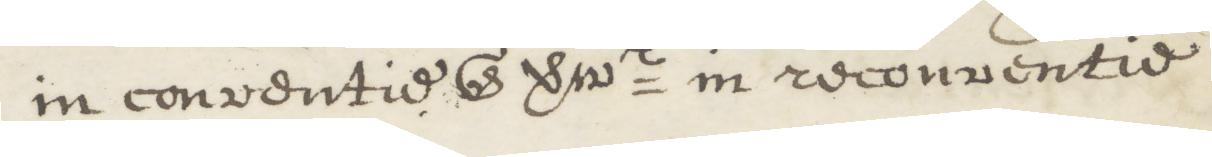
in conventie ende verw=r in reconventie
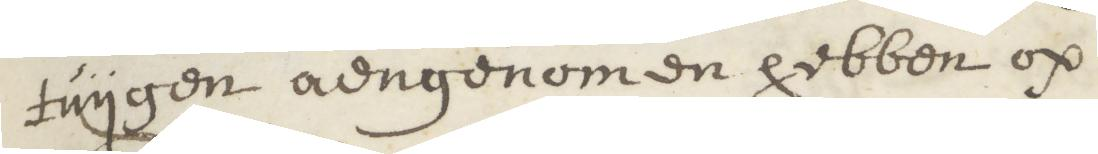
tuijgen aengenomen hebben op
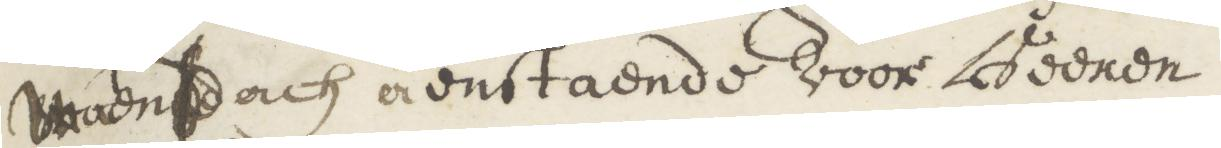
woensdach aenstaende voor Heeren
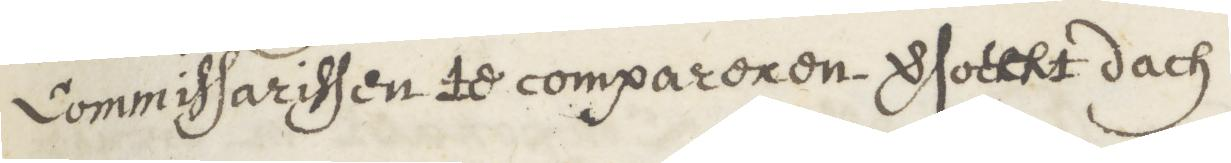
Commissarissen te compareren versoeckt dach
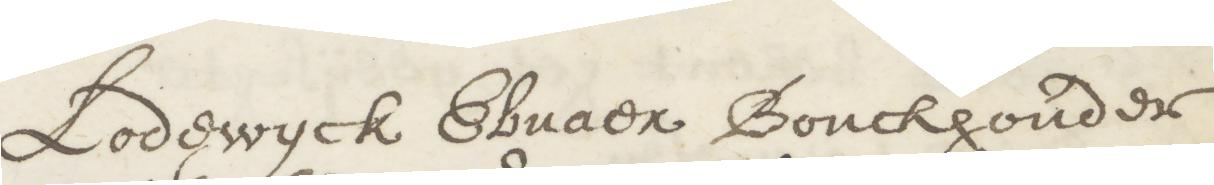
Lodewyck Ebuaer Bouckhouder
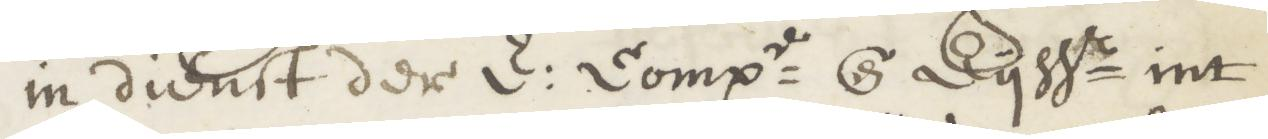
in dienst der E: Comp=e ende Eijss=r int
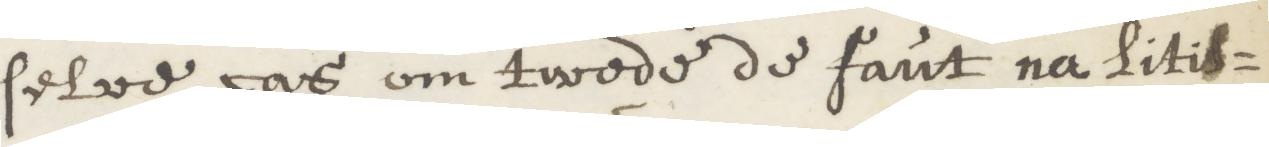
selve cas om twede de faut na litis=
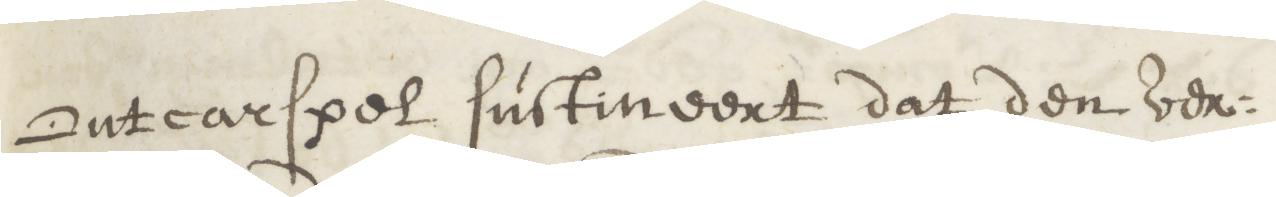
Outcarspel sustineert dat den ver=
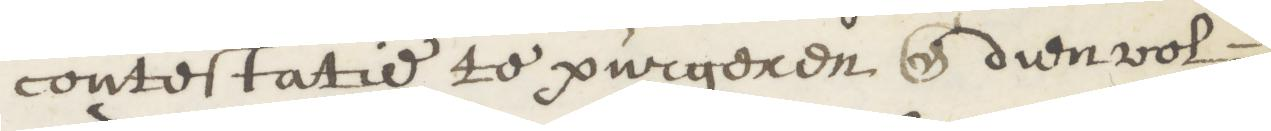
contestatie te purgeren ende dienvol=
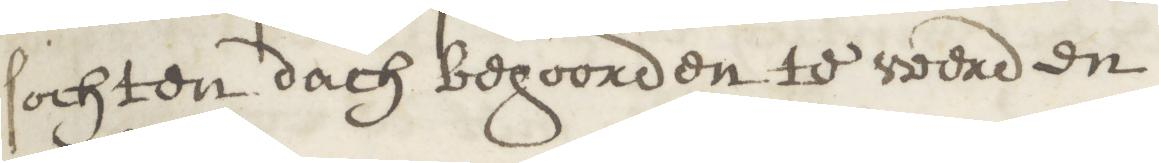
sochten dach behoorden te werden
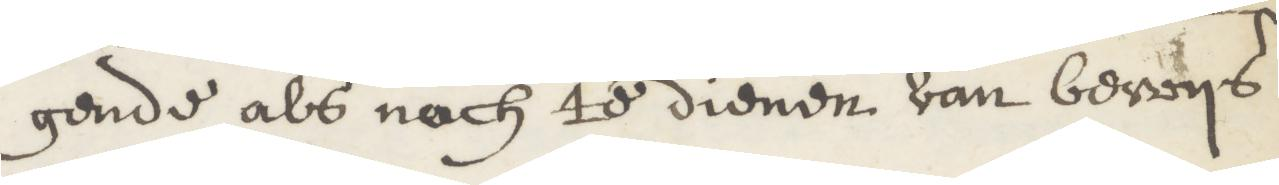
gende als noch te dienen van bewijs
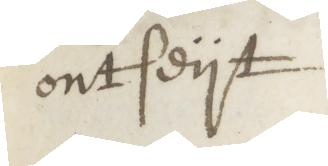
ontseijt
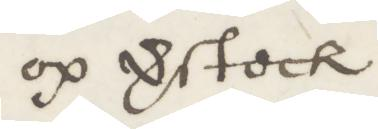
op versteck
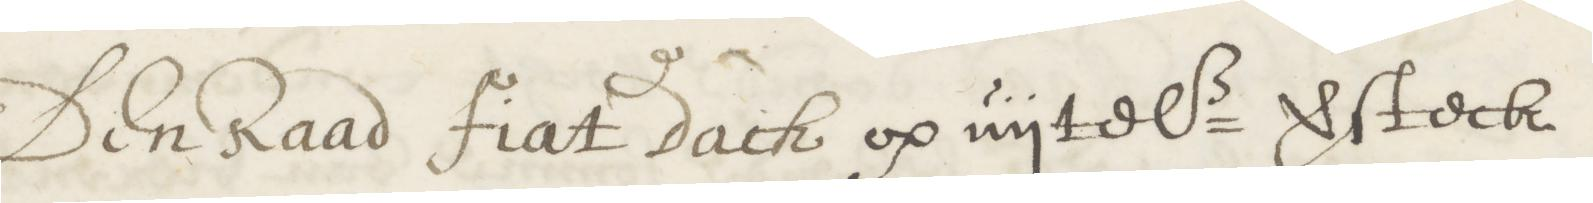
Den Raad Fiat dach op uijtel= versteck
